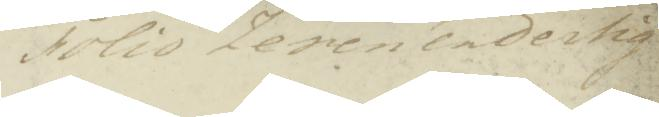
Folio Zeven en dertig
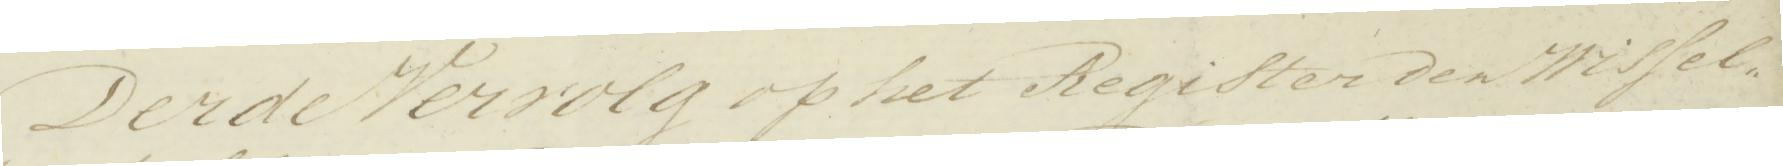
Derde Vervolg op het Register der Wissel„
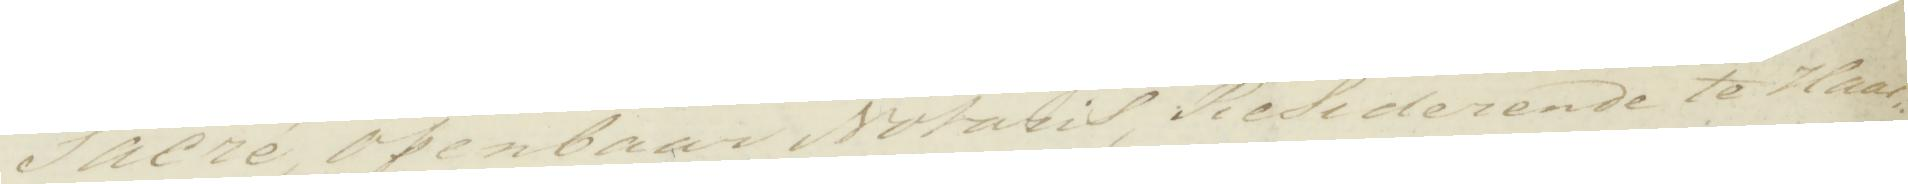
Sacré, openbaar Notaris, Residerende te Haar„
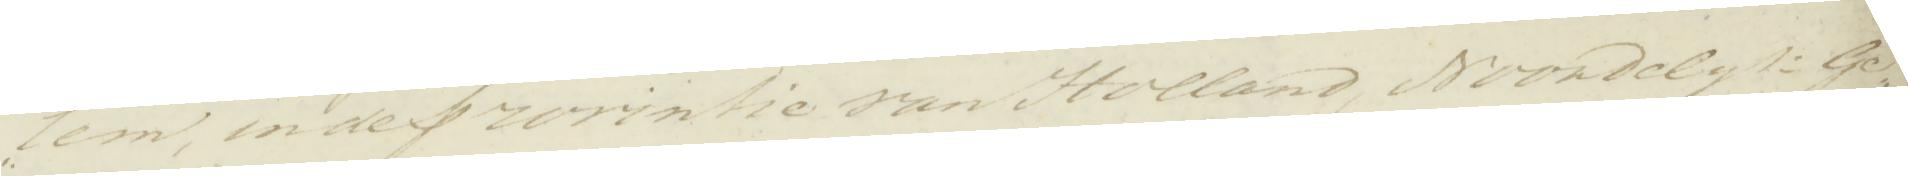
„lem, in de provintie van Holland, Noordelyk ge„
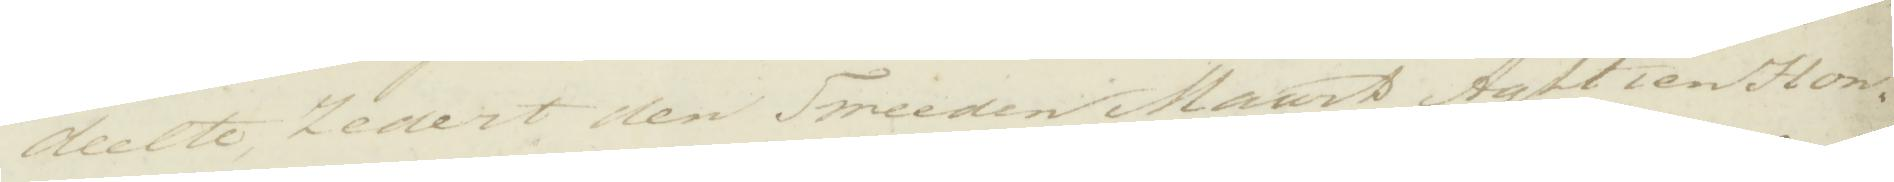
deelte, zedert den Tweeden Maart Agttien Hon„
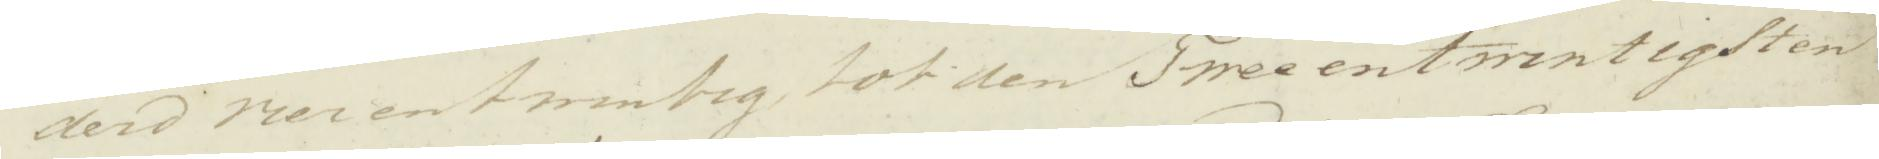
derd vier en twintig, tot den Twee en twintigsten
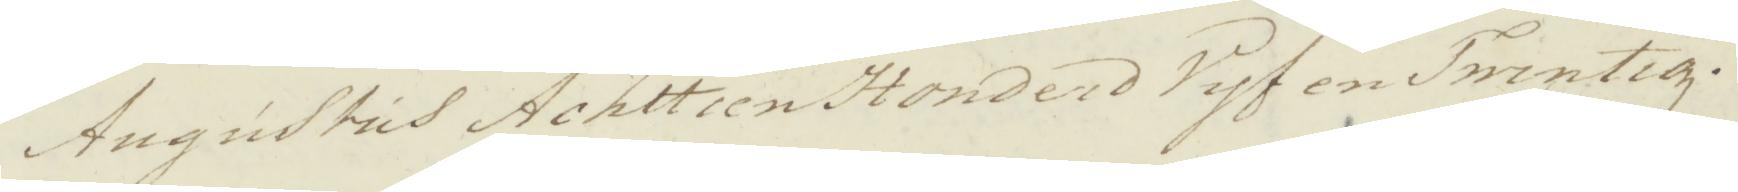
Augustus Achttien Honderd Vyf en Twintig.
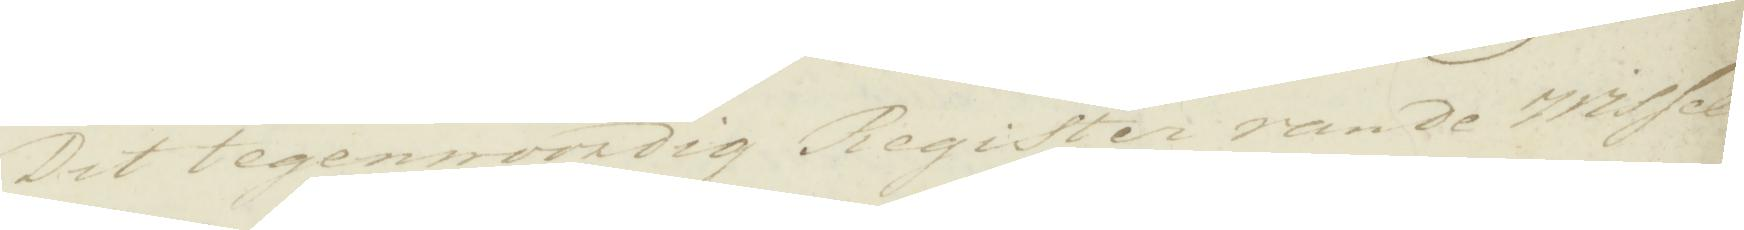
Dit tegenwoordig Register van de wissel
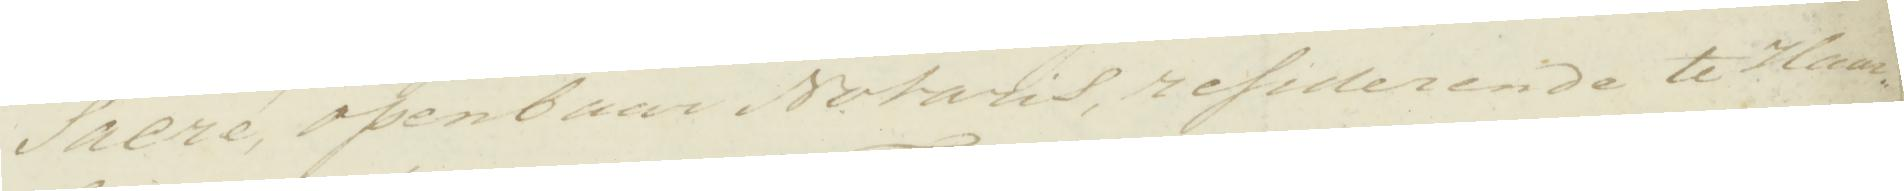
Sacré, openbaar Notaris, residerende te Haar„
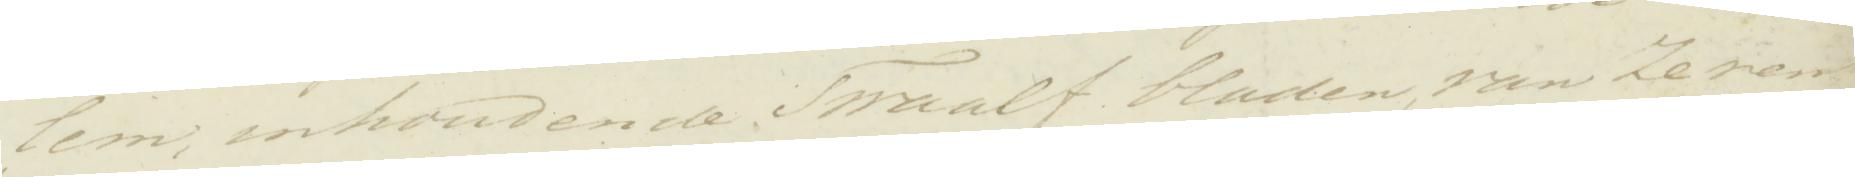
„lem; inhoudende Twaalf bladen, van Zeven
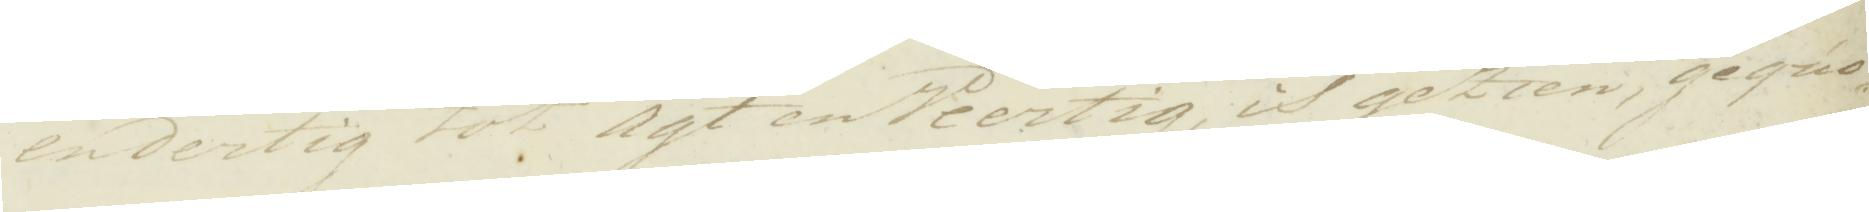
en dertig tot agt en Veertig, is gezien, gequo„
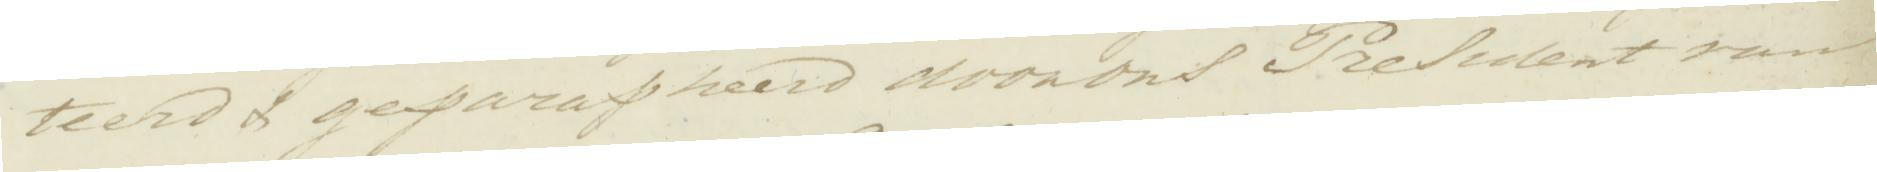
teerd & geparapheerd door ons President van
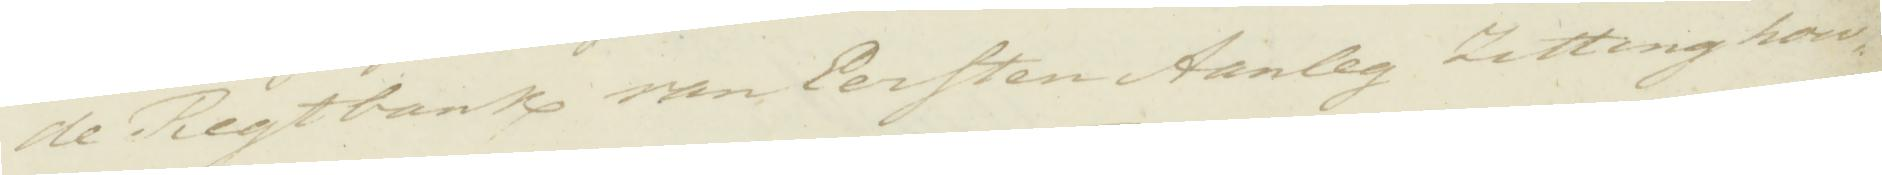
de Regtbank van Eersten Aanleg zitting hou„
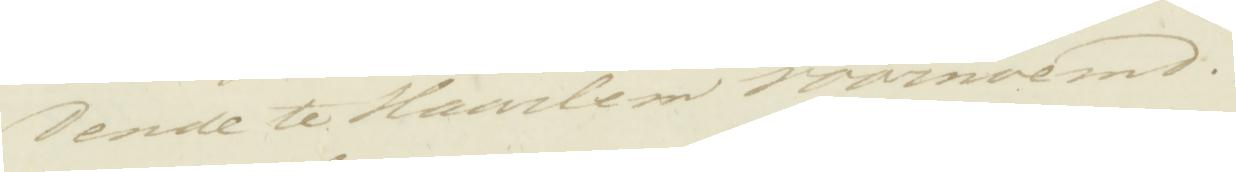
dende te Haarlem voornoemd.
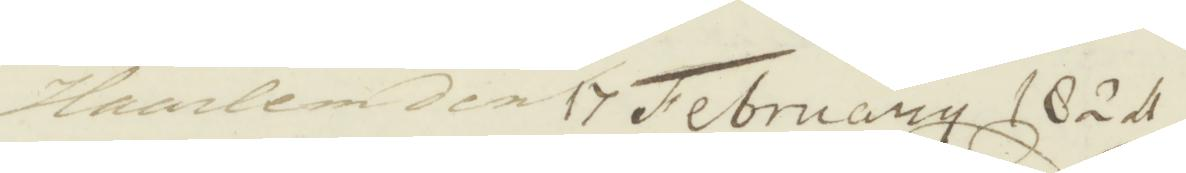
Haarlem den 17 February 1824
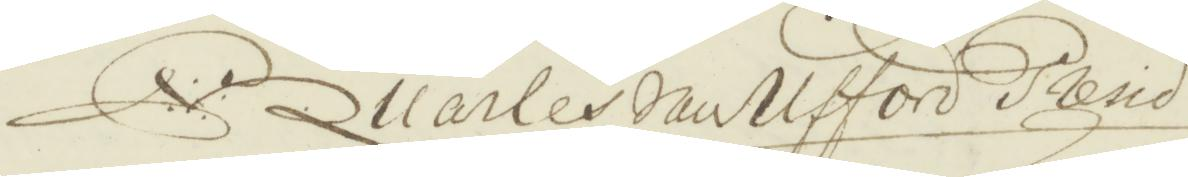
Quarles van Ufford Presid
